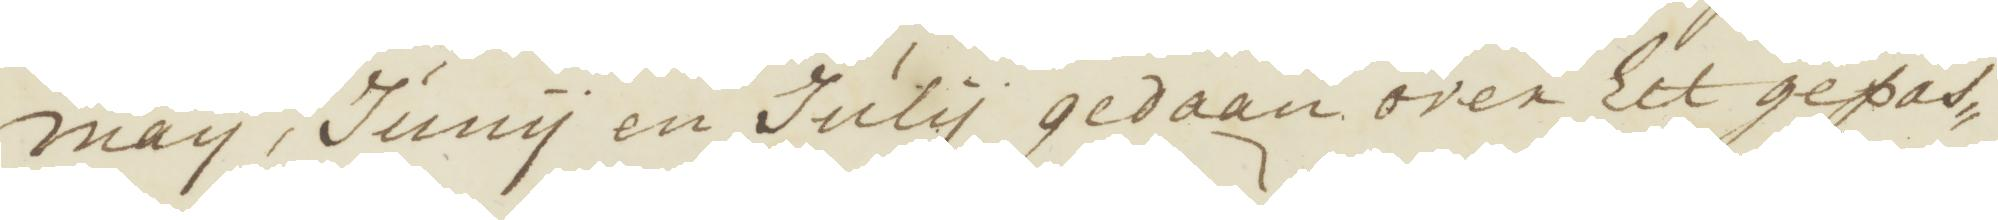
maij, Junij en Julij gedaan over het gepas„
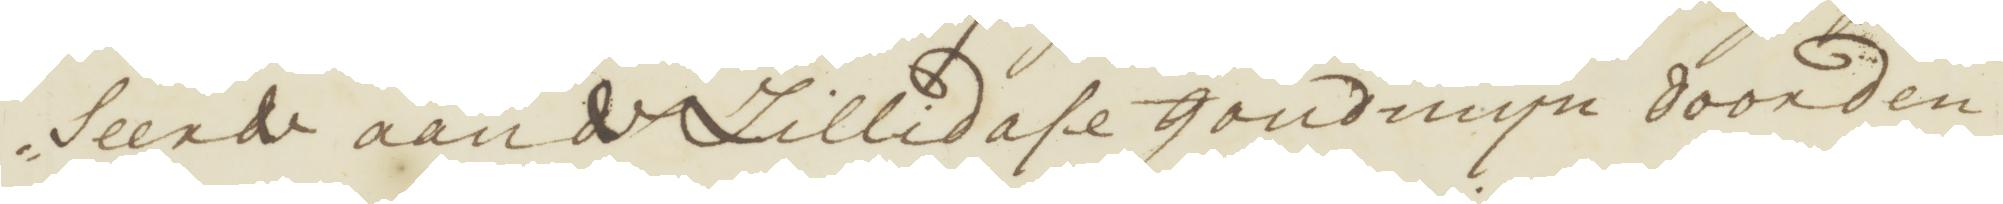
„seerde aan de zillidase goudmijn door den
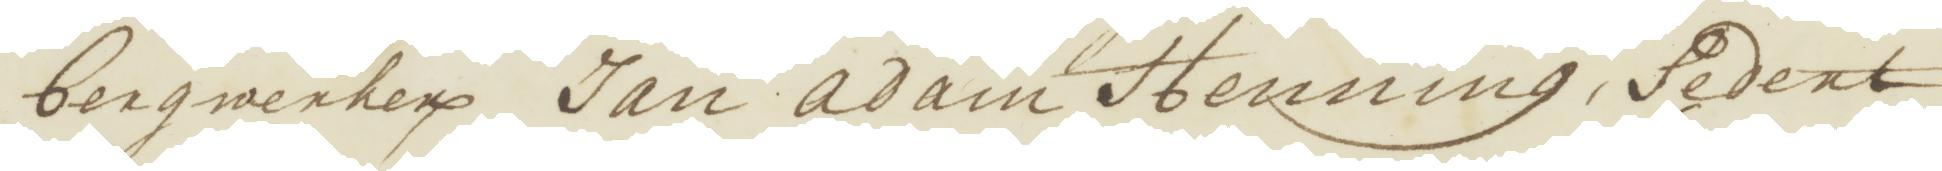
bergwerker Jan Adam Henning, sedert
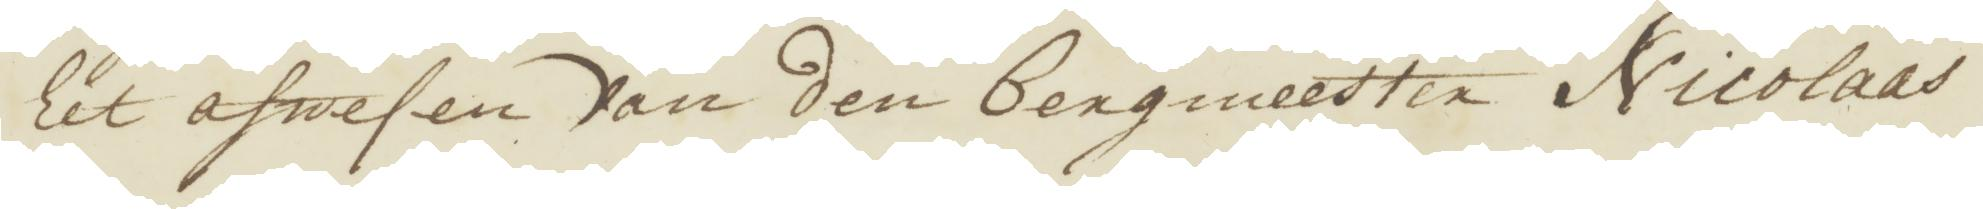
het afwesen van den bergmeester Nicolaas
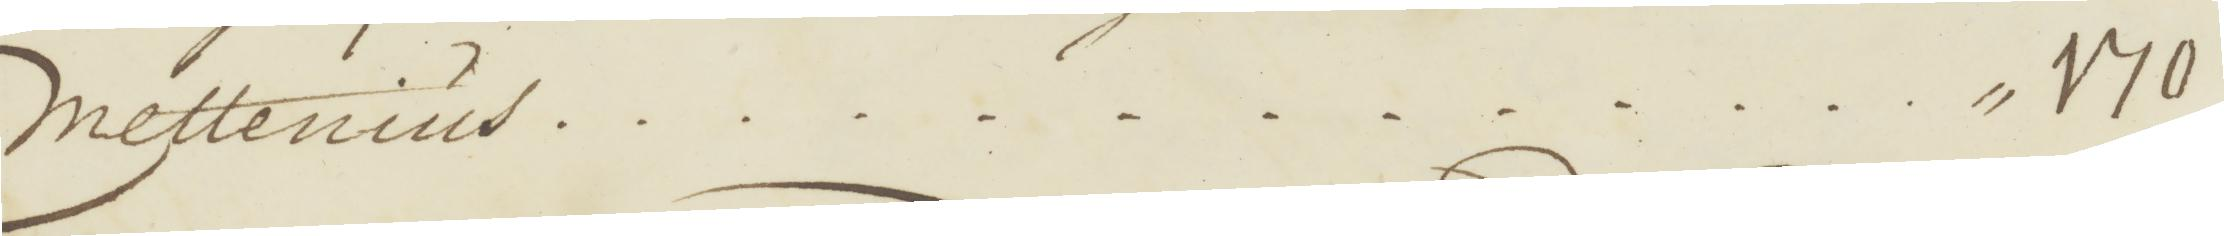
mettenius. . . . . . . . . . . . . „ 170
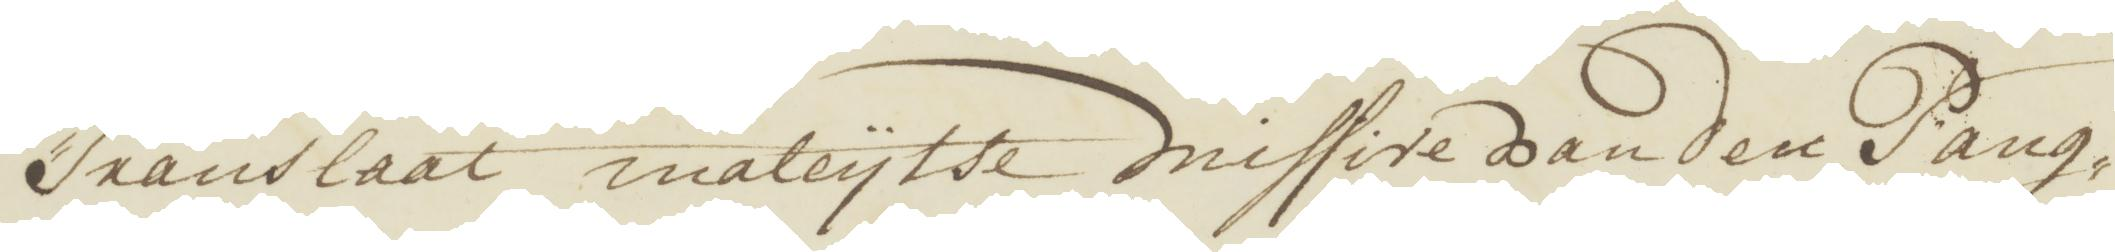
Translaat maleijtse missive van den Pang„
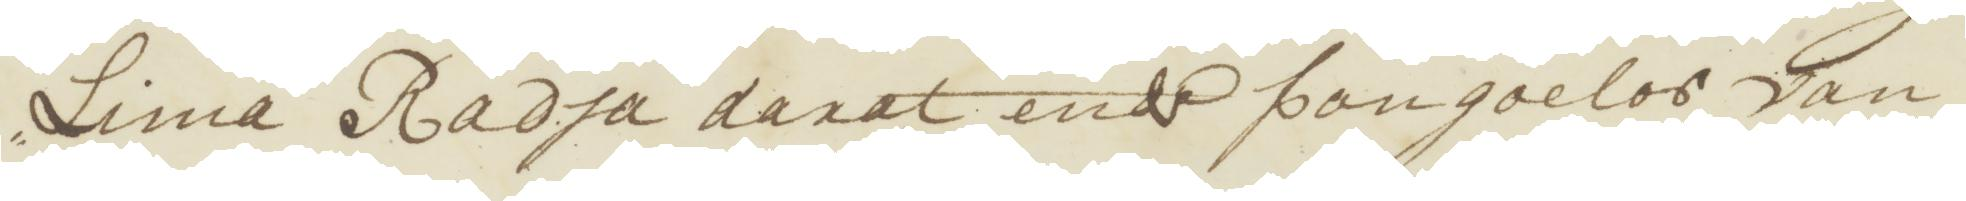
„lima Radja darat ende Pongoelos van
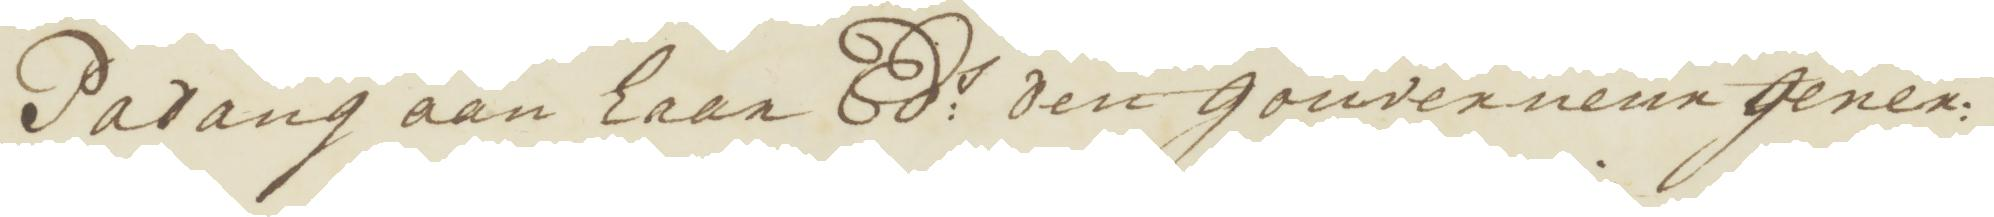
Padang aan haar Ed:s den gouverneur gener:l
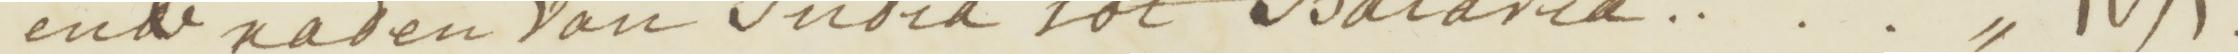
ende raden van India tot Bataria. . . . „ 181.
